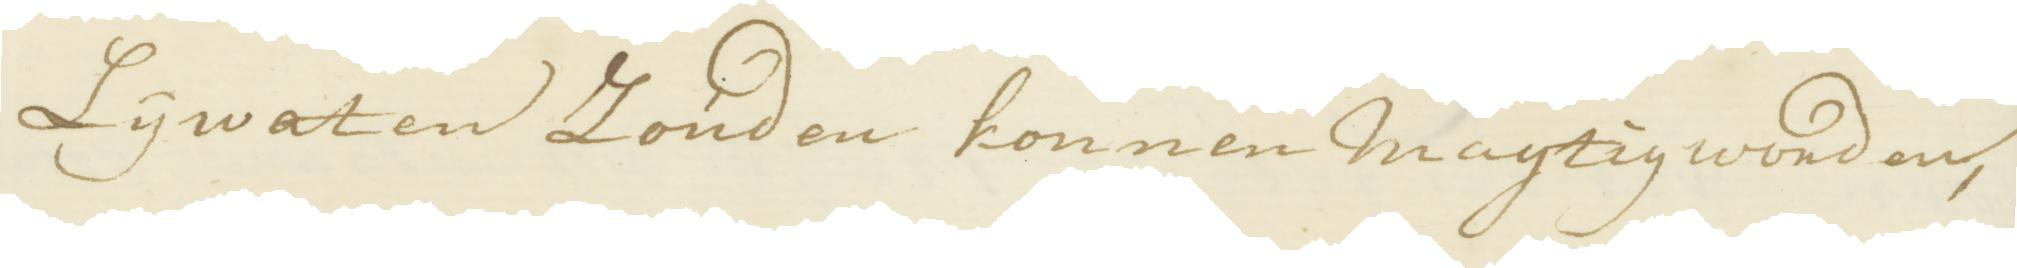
Lijwaten zouden konnen magtig worden,
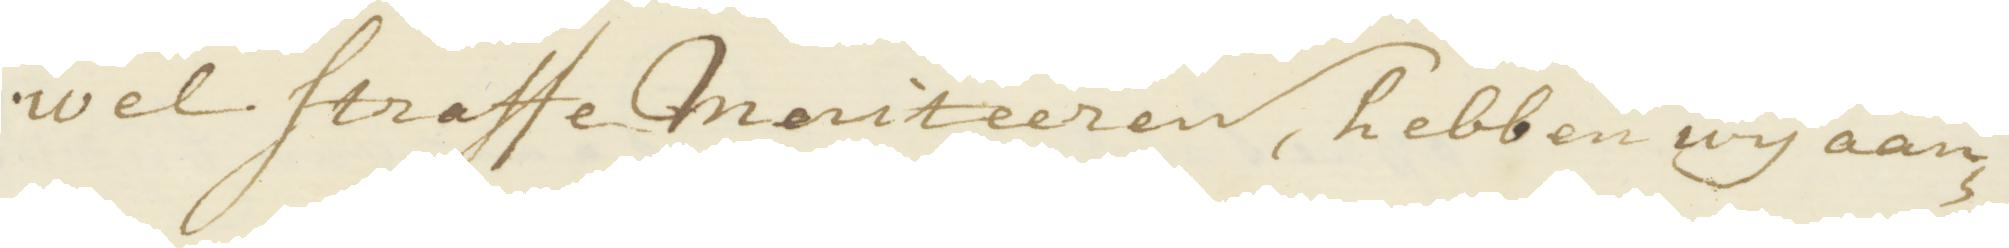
wel straffe meriteeren, hebben wij aan„
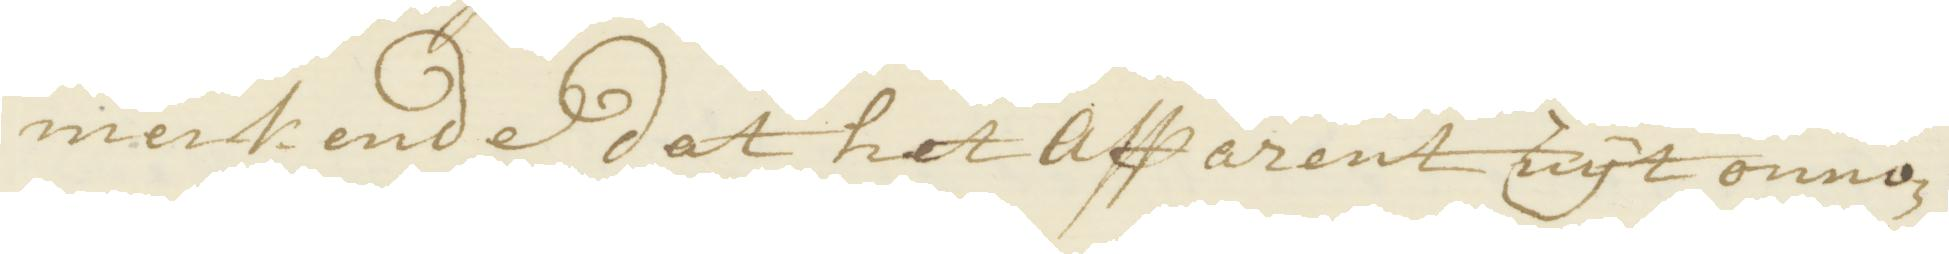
merkende dat het apparent uijt onno
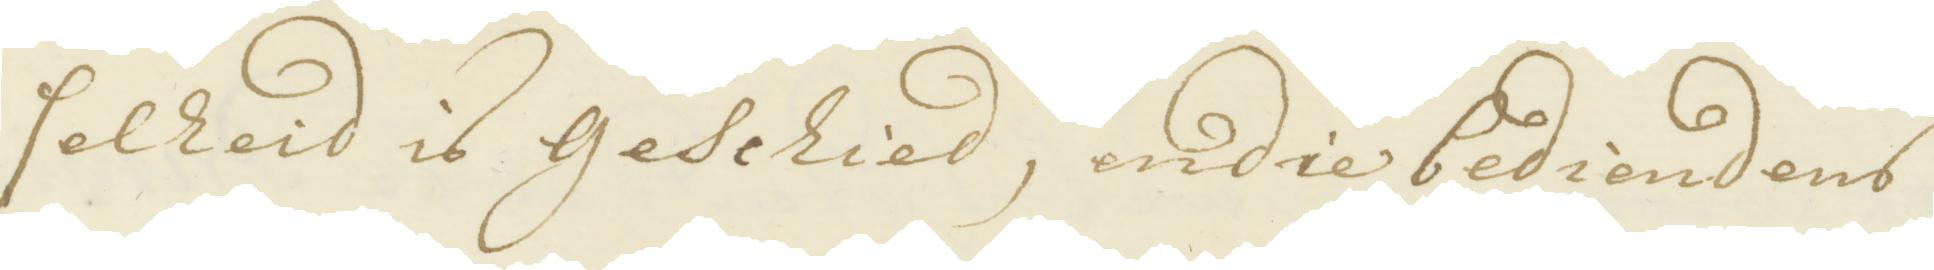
selheid is geschied, en die bediendens
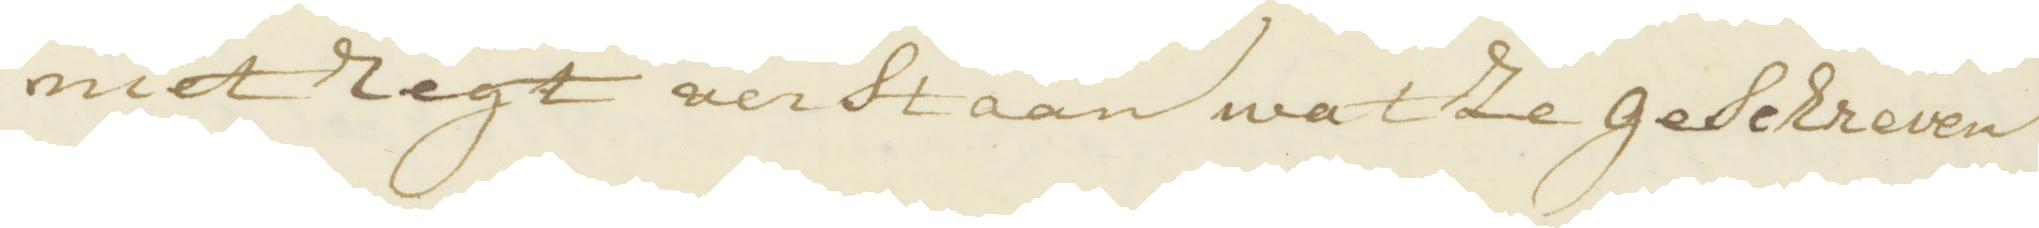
niet regt verstaan wat ze geschreven
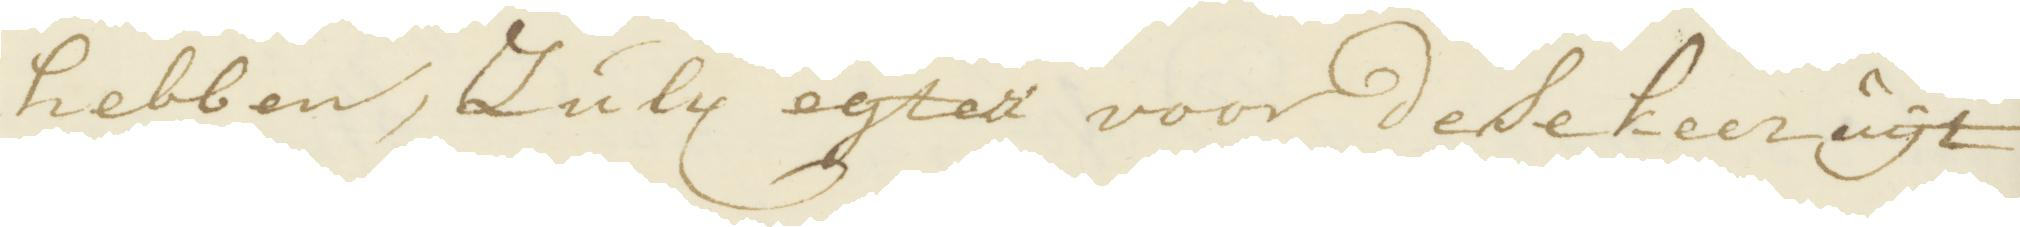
hebben, zulx egter voor dese keer uijt
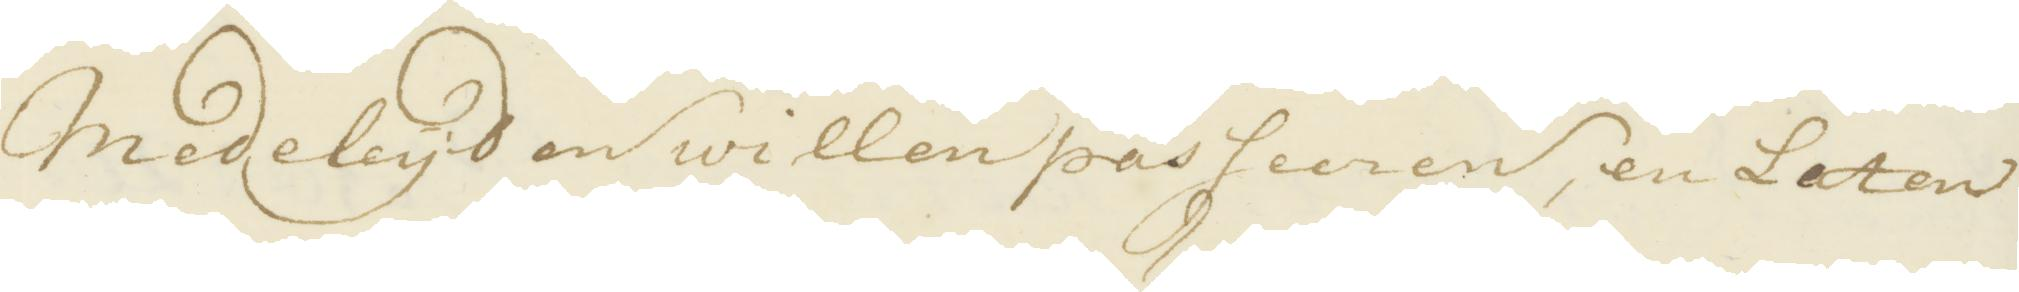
medeleijden willen passeeren, en laten
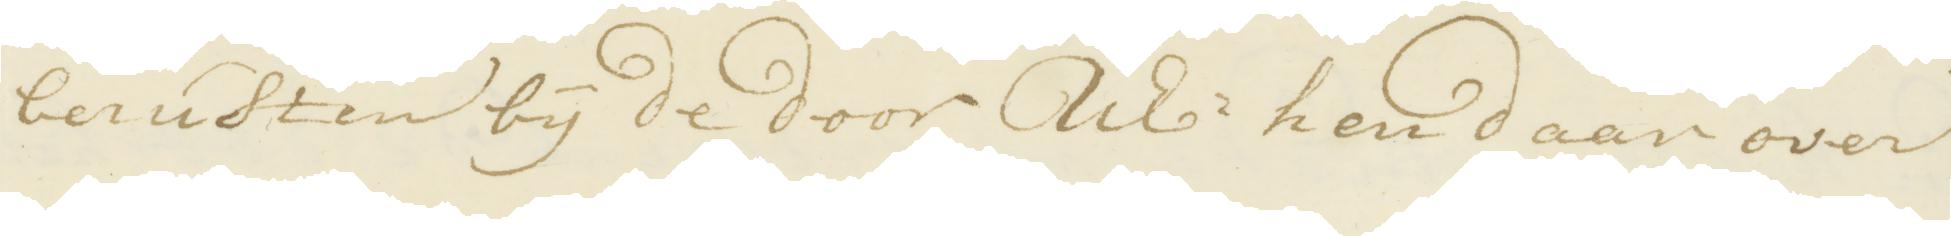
berusten bij de door UE: hen daar over
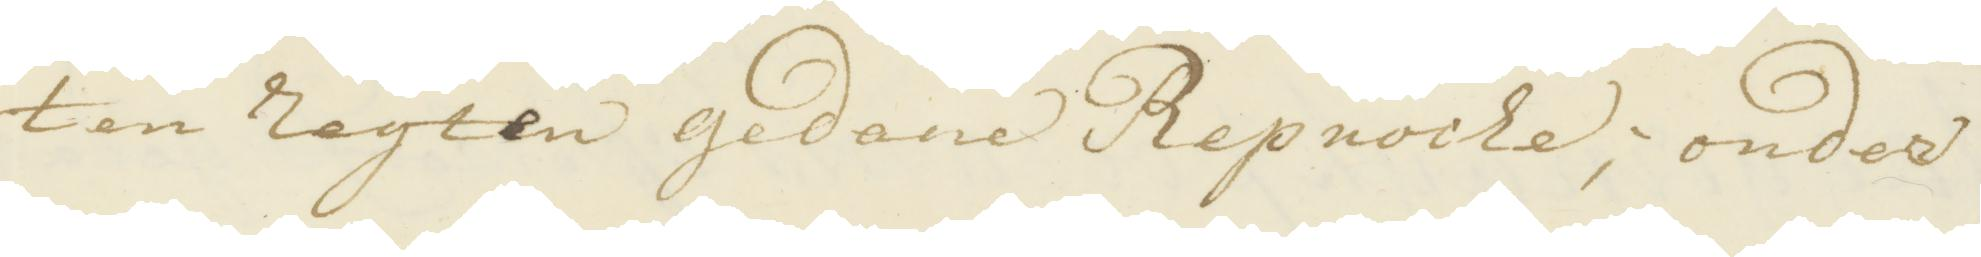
ten regten gedane Reproche; onder
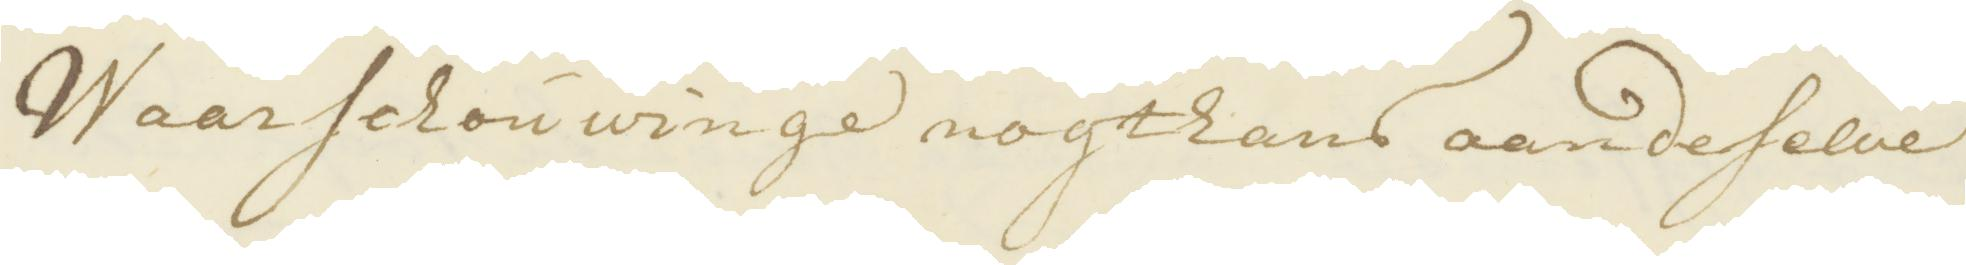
Waarschouwinge nogthans aan deselve
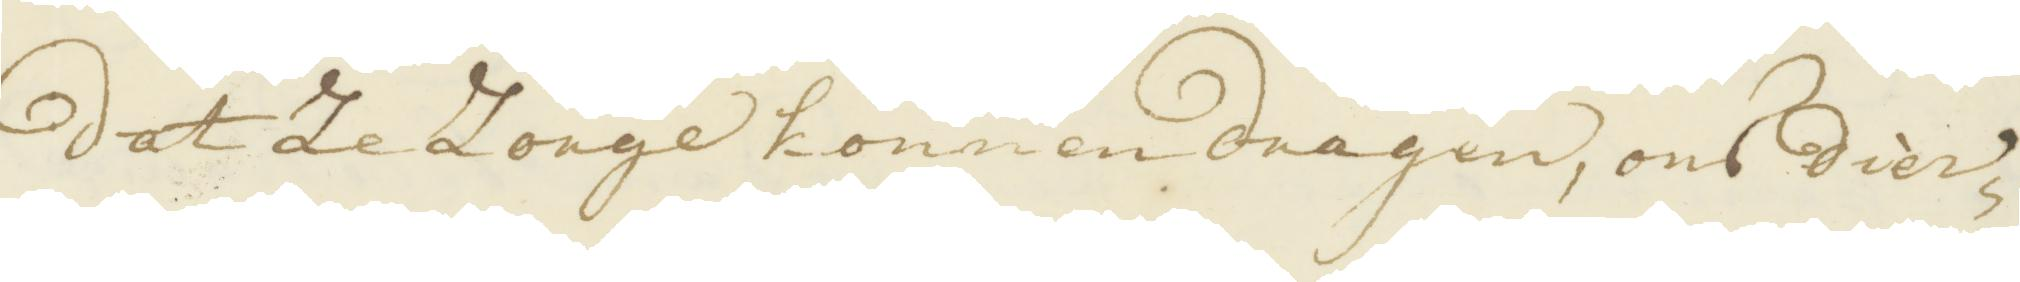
dat ze zorge konnen dragen, ons dier„
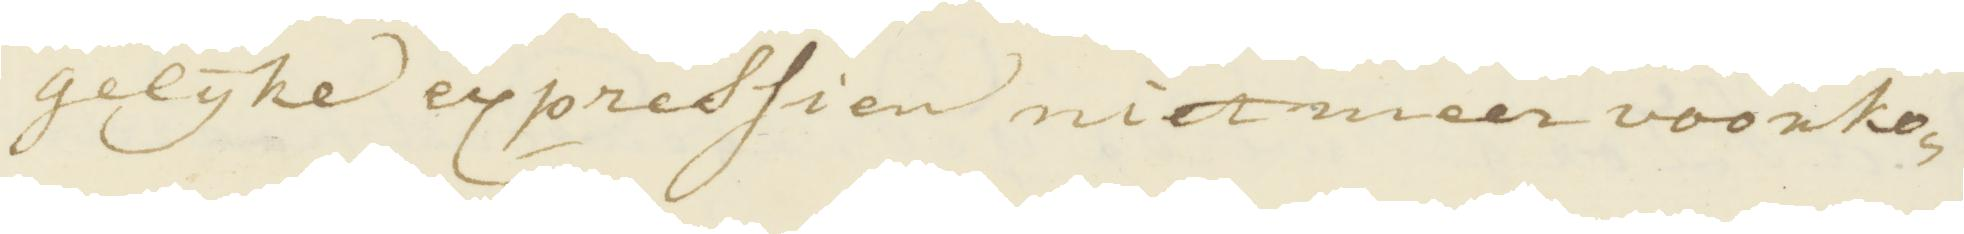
gelijke expressien niet meer voorko„
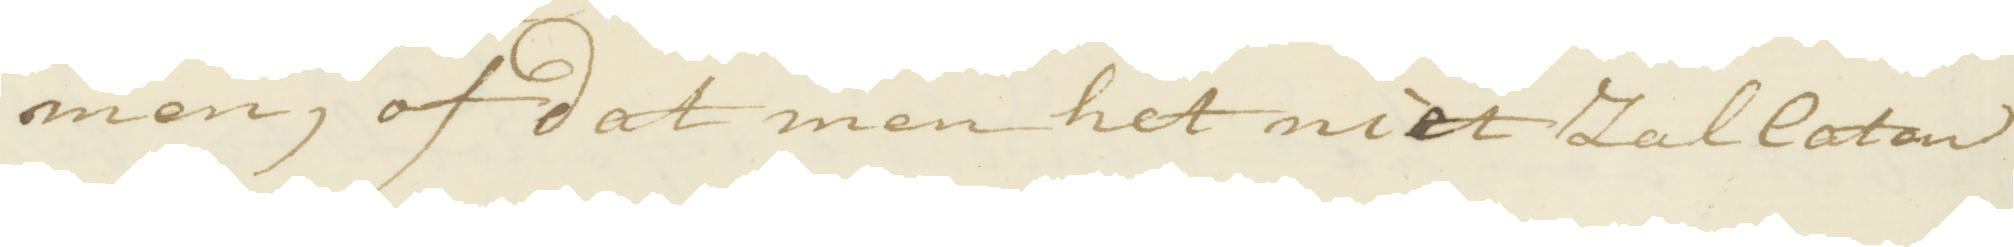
men, of dat men het niet zal laten
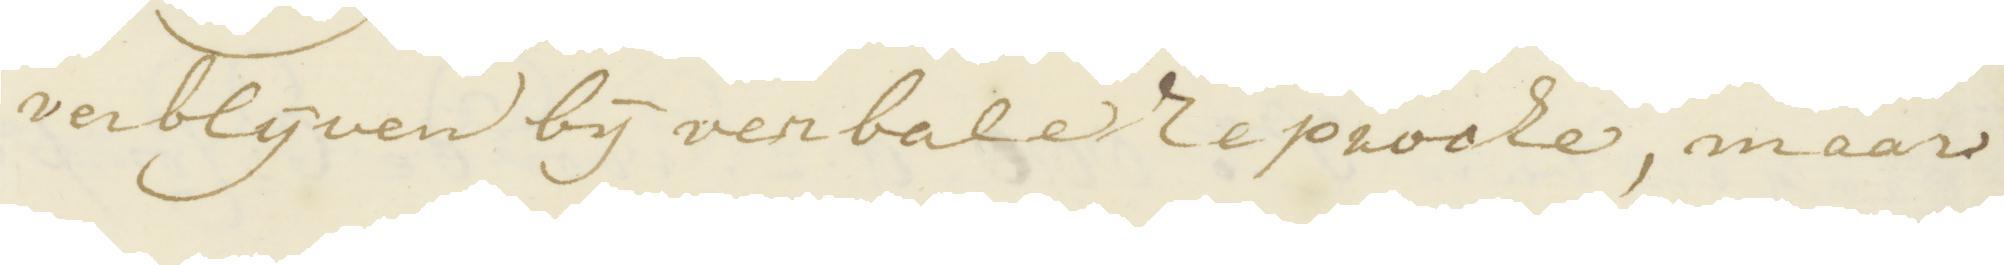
verblijven bij verbale reproche, maar
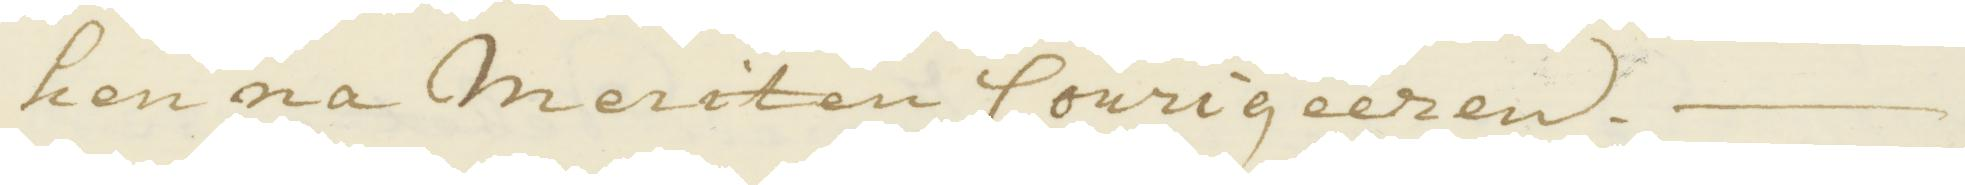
hen na meriten Corrigeeren. —
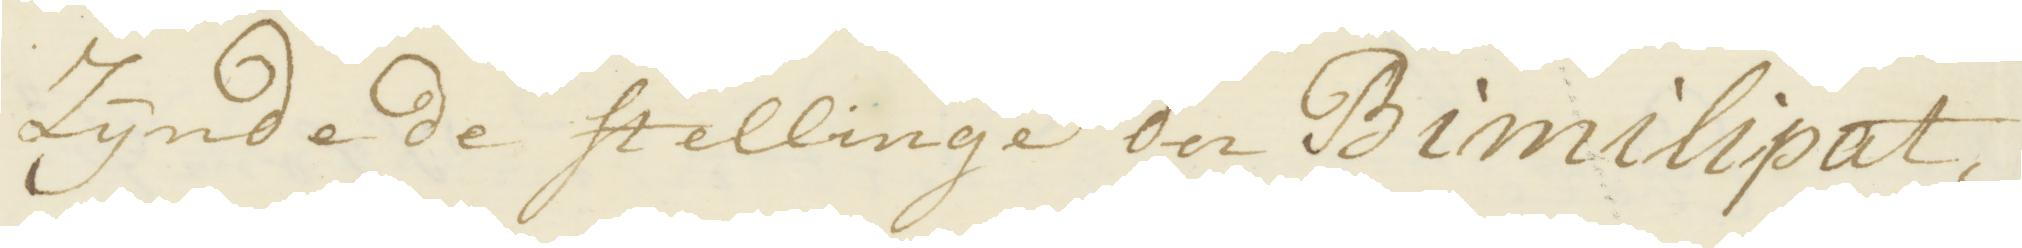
Zijnde de stellinge der Bimilipat„
